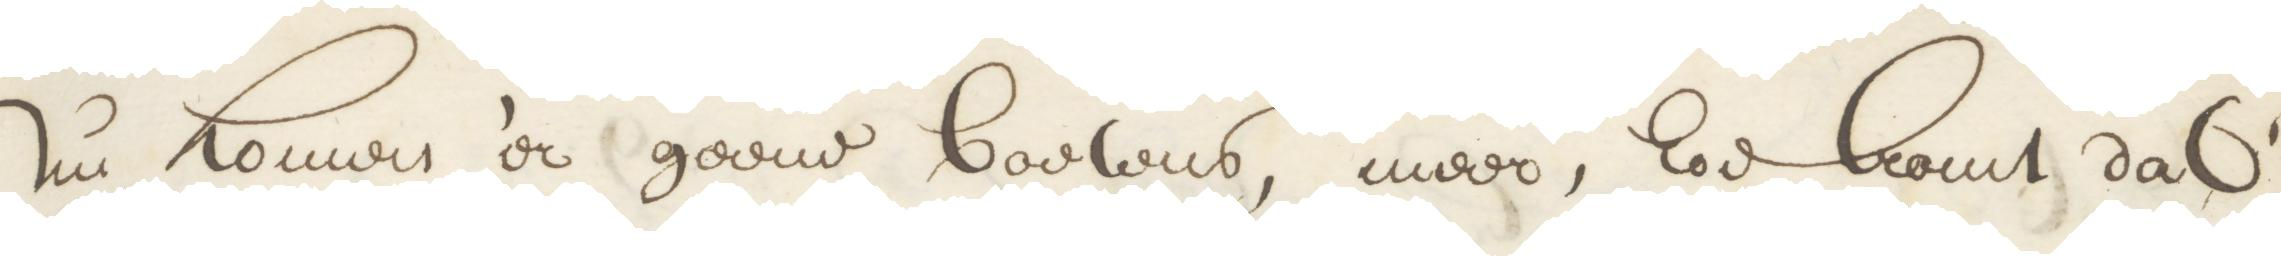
nu komen 'er geene boetens, meer, hoe komt dat
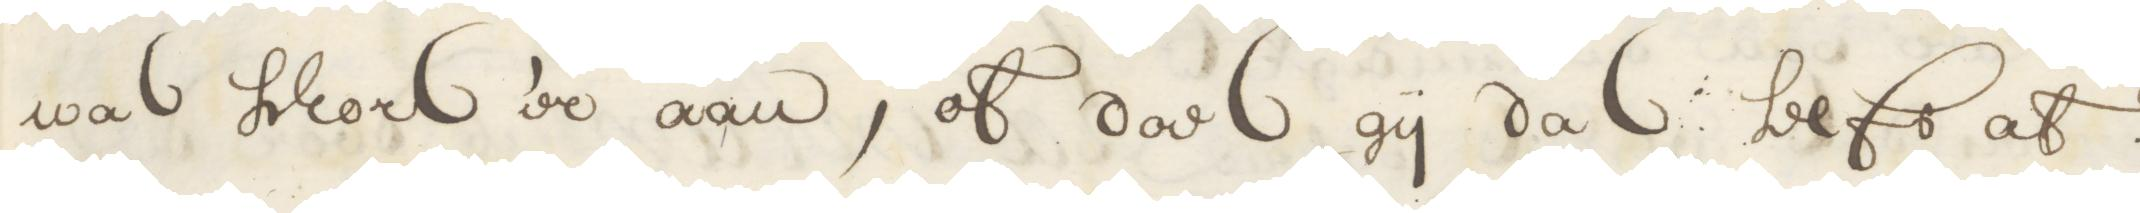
wat schort 'er aan, of doet gij dat selfs af
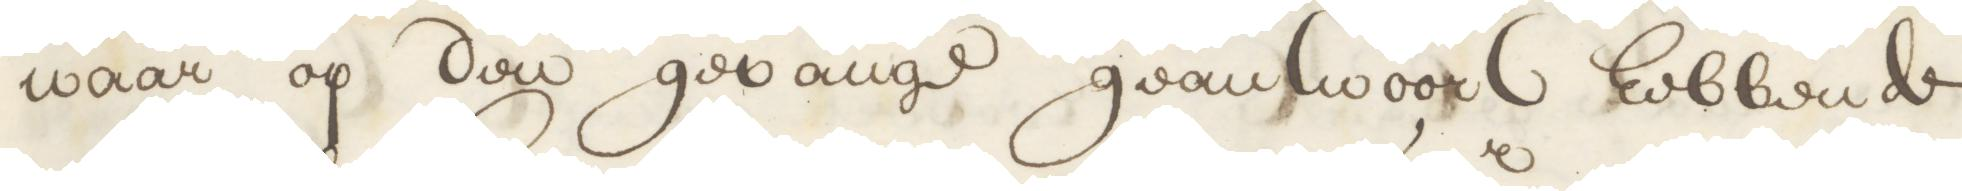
waar op den gevange geantwoort hebbende
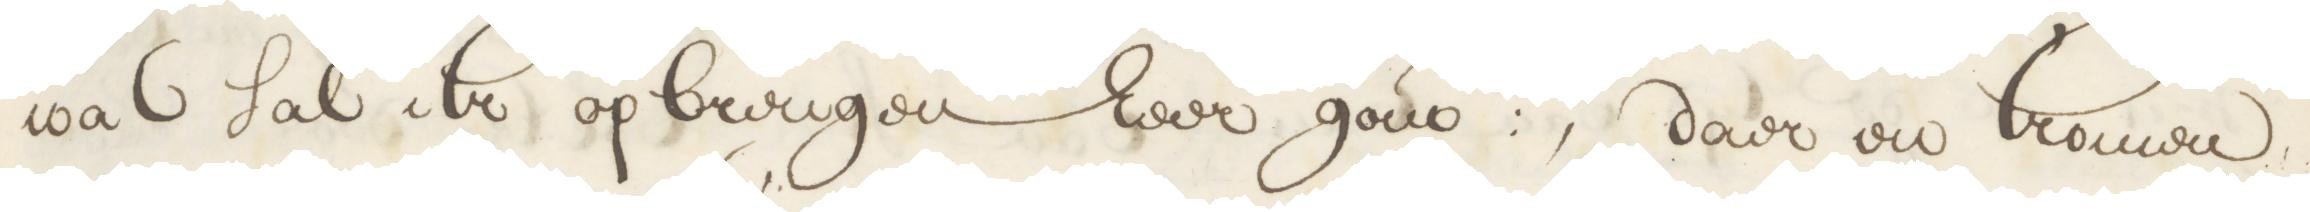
wat sal ik opbrengen heer gouv:r, daer en komen
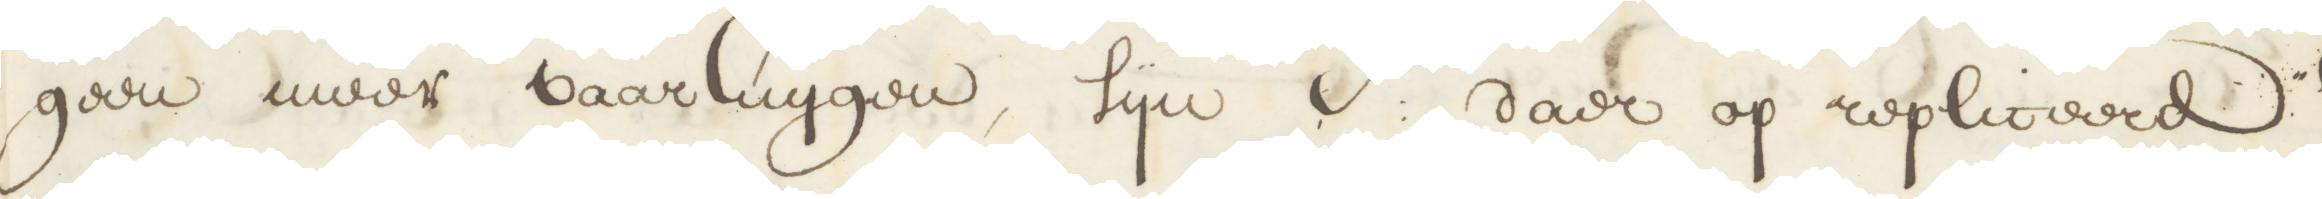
geen meer vaartuijgen, sijn E: daer op repliceerd
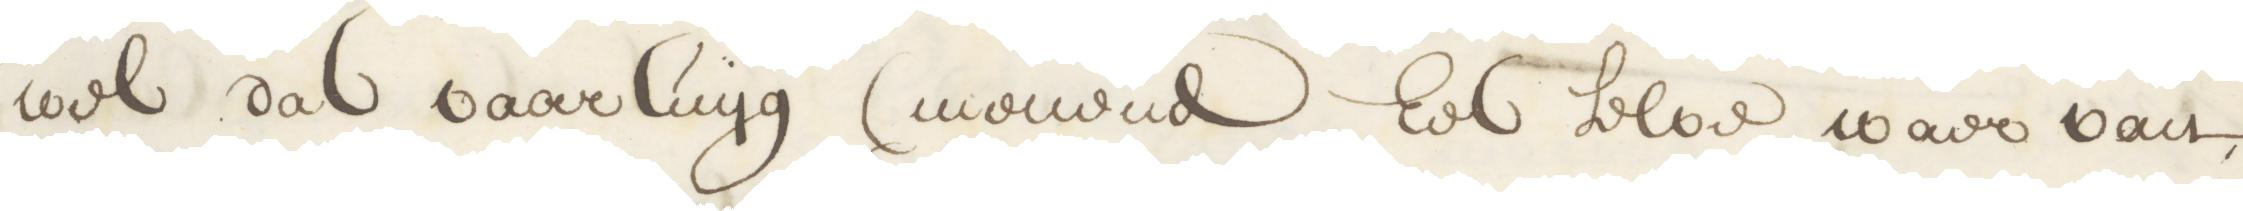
wel dat vaartuijg (menend het selve waer van,
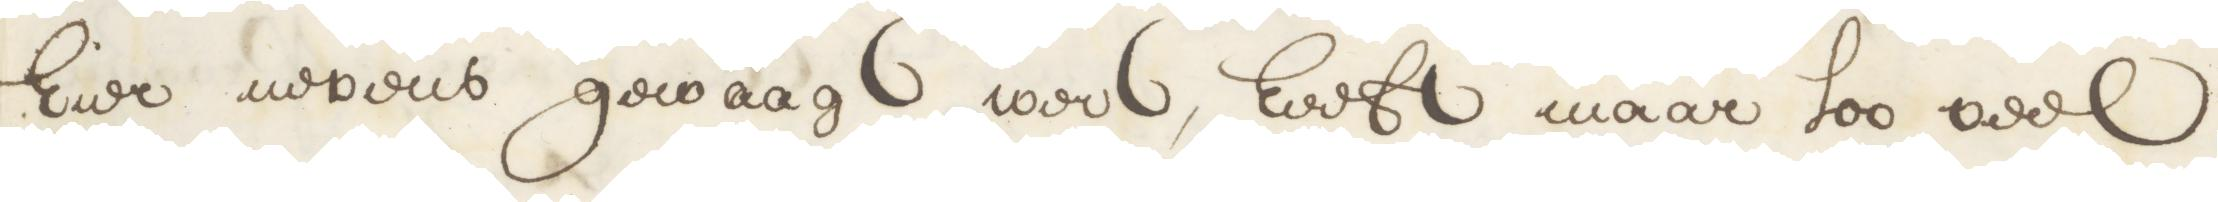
hier nevens gewaagt wert, heeft maar soo veel
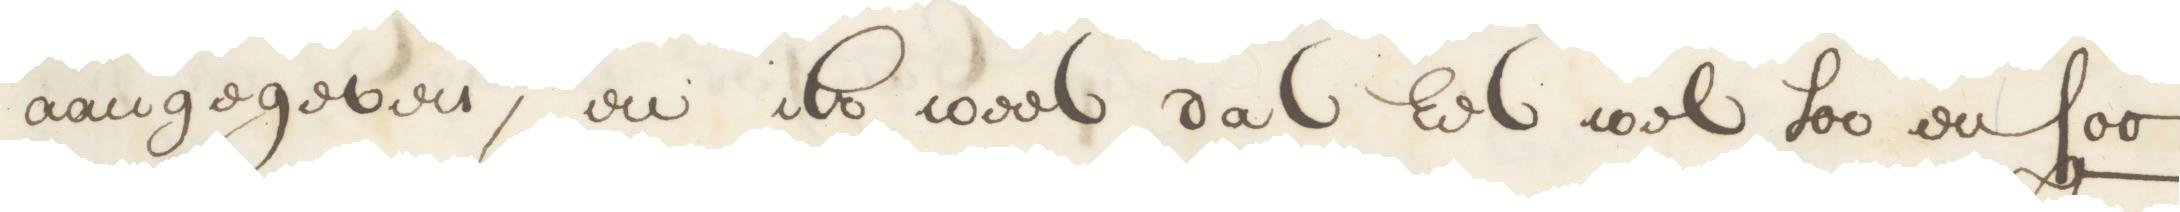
aan gegeven, en ik weet dat het wel soo en soo
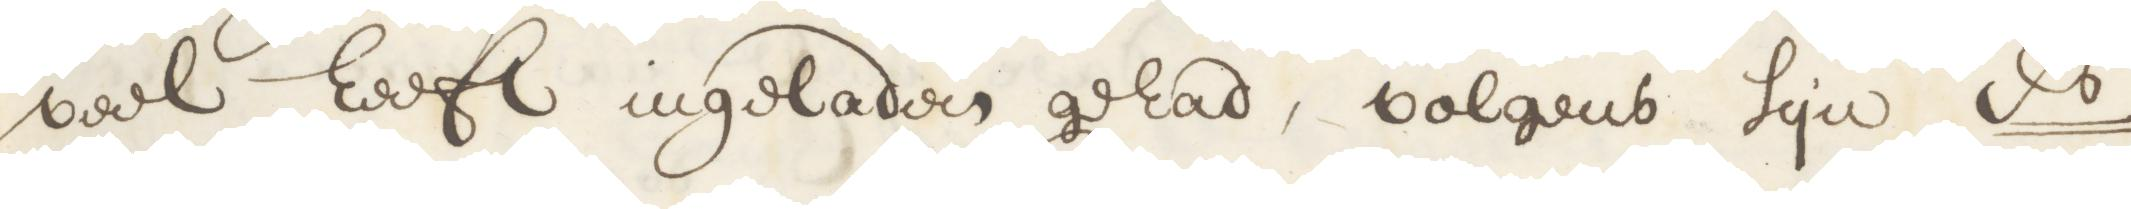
veel heeft ingeladen gehad, volgens sijn E=s
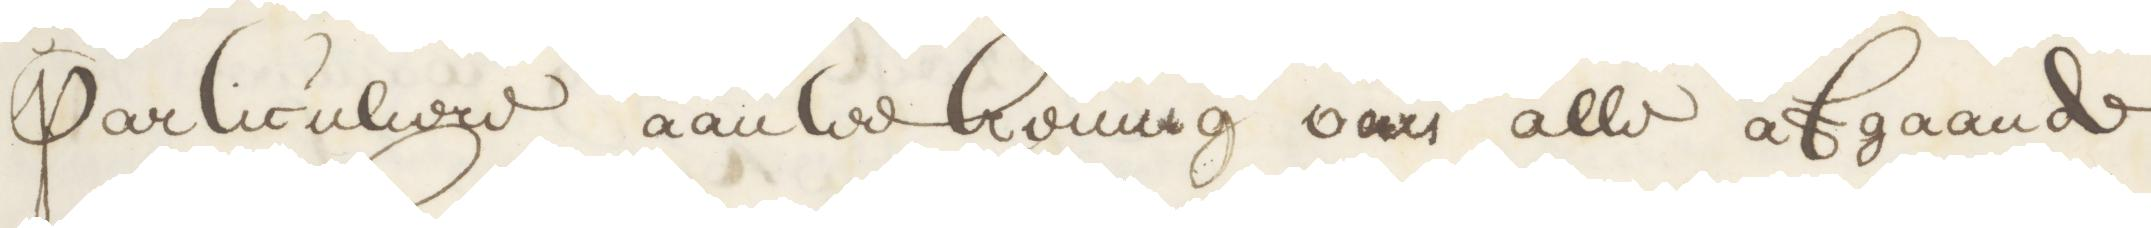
Particuliere aanteekening van alle afgaande
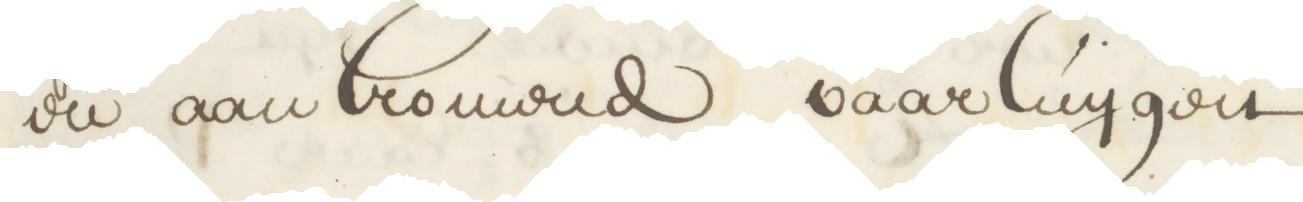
en aan komende vaartuijgen
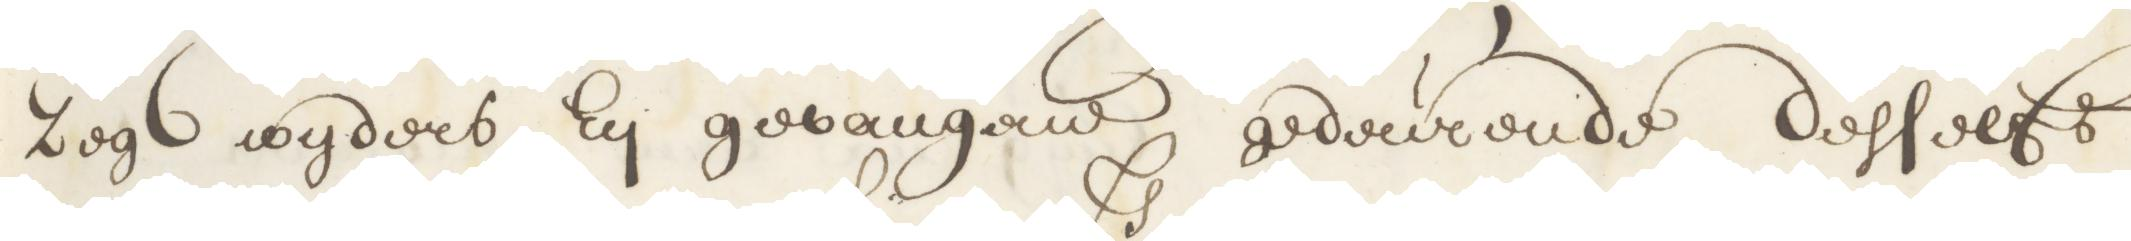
Zegt wijders hij gevangene gedeurende desselfs
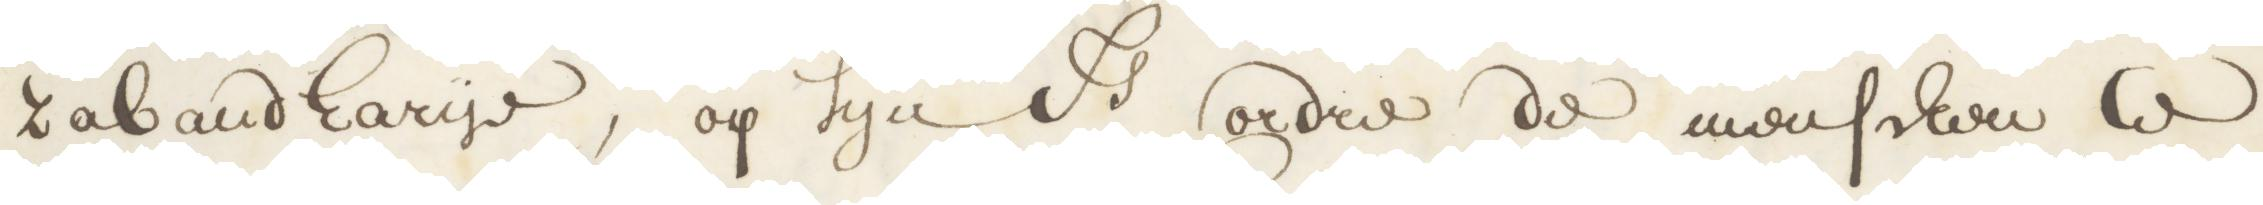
zabandharije, op sijn E.s ordre de menschen te
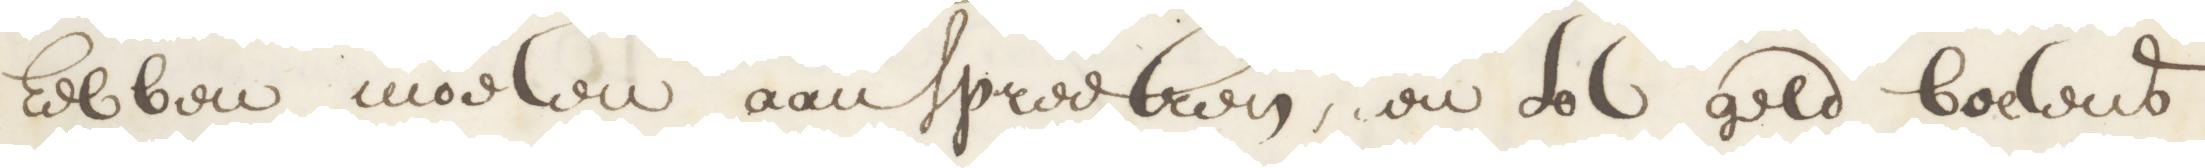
hebben moete aanspreeken, en tot geld bodens
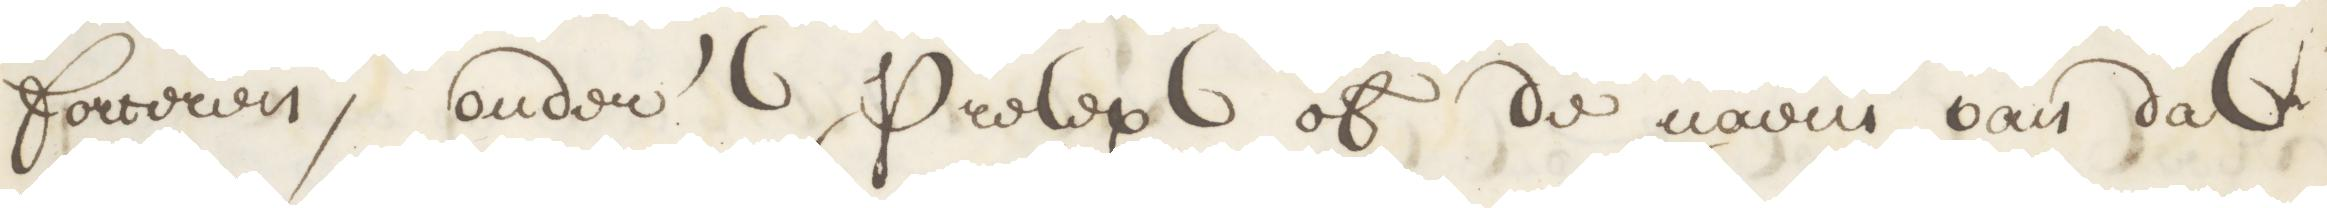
forteren, onder 't Pretext of de naem van dat
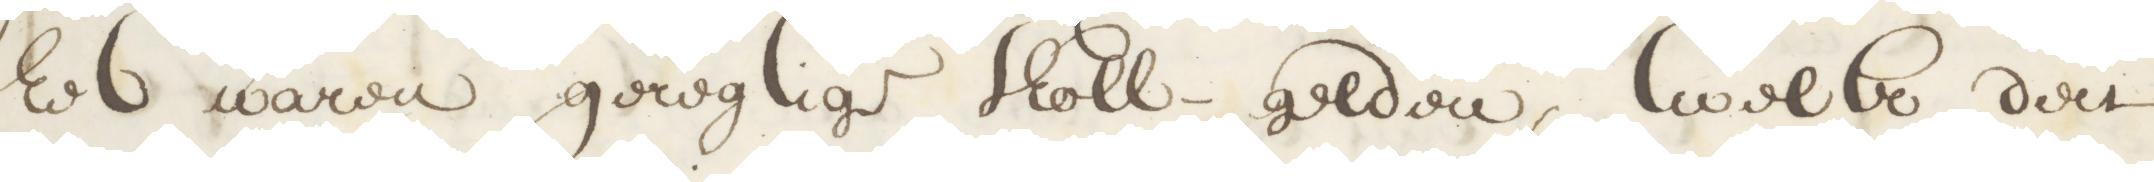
het waren geregtige tholl-gelden, twelk den
